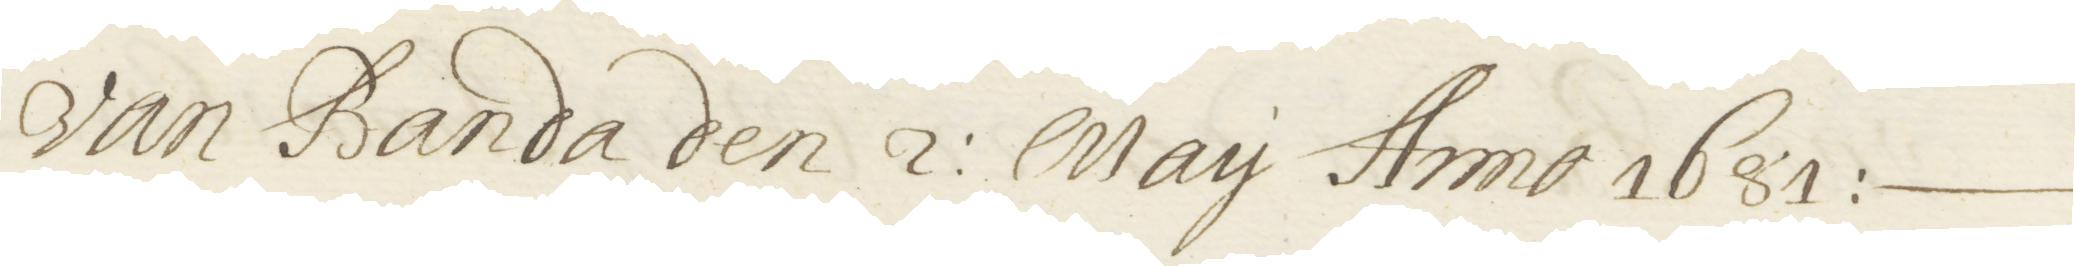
van Banda den 2: Maij Anno 1681:—
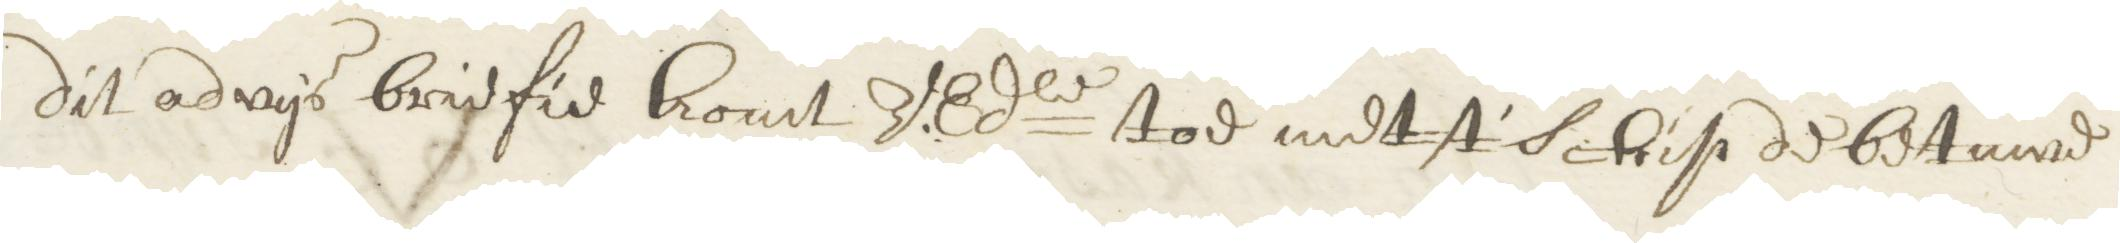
dit advijs briefie komt V:Ed=le toe met t' schip de betuwe
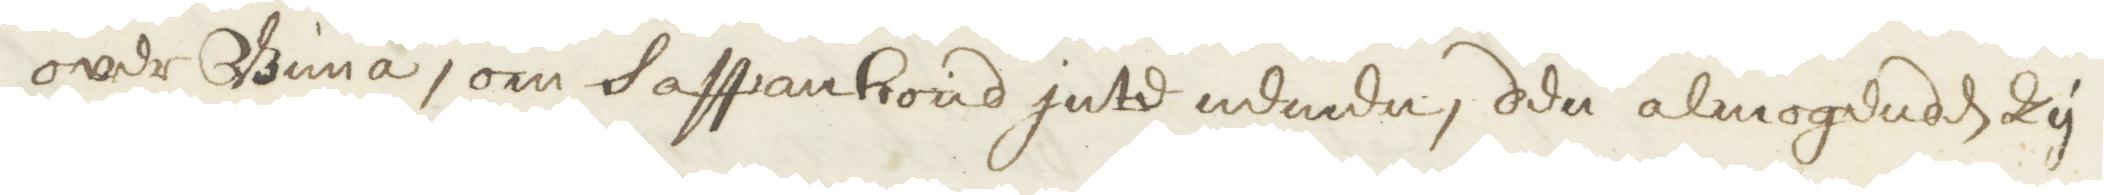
over Bima, om sappanhoud jnte nemen, den almogenden zij
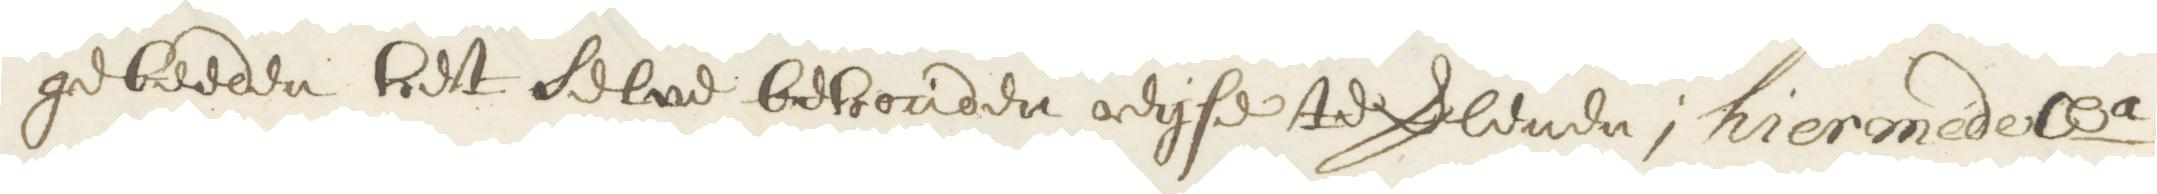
gebeeden het selve behouden reijse te verlenen; hier mede &ca
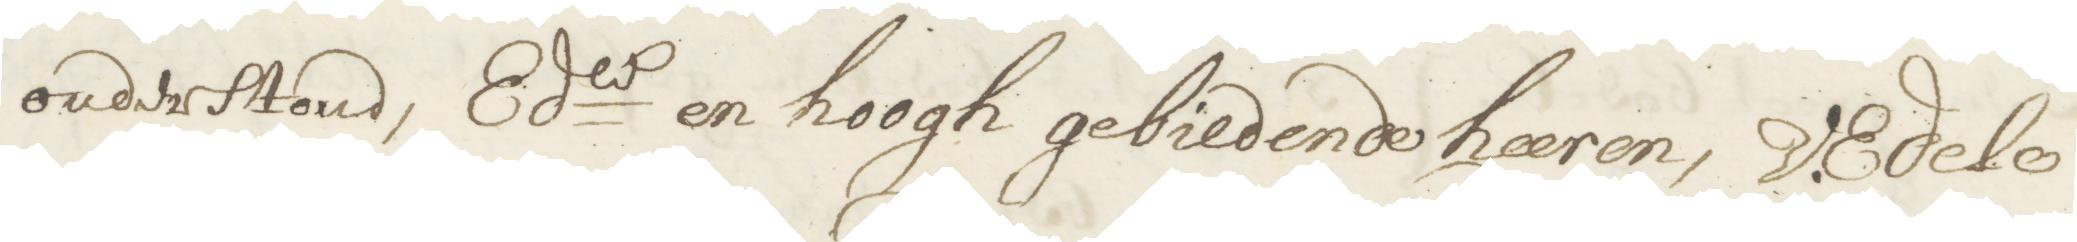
onderstond, Ed=le en hoogh gebiedende heeren, V. Edele
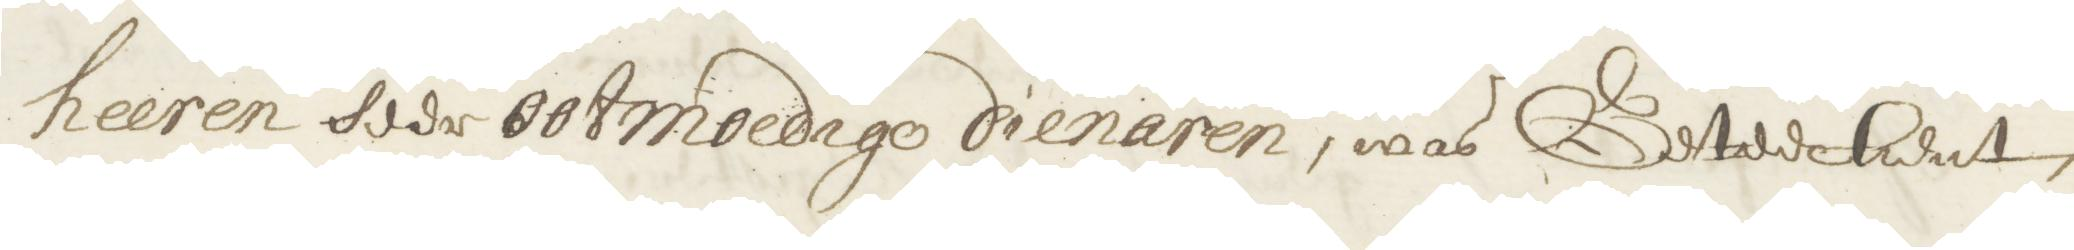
heeren seer ootmoedige dienaren, was Geteeckent,
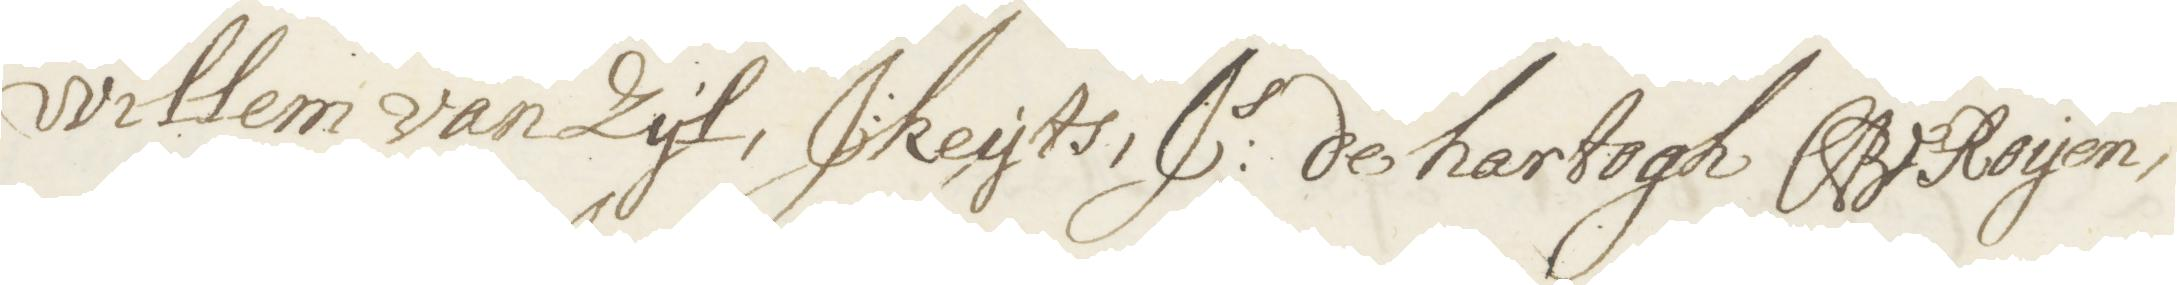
willem van zijl, J:keijts, J:s de hartogh Av Roijen,
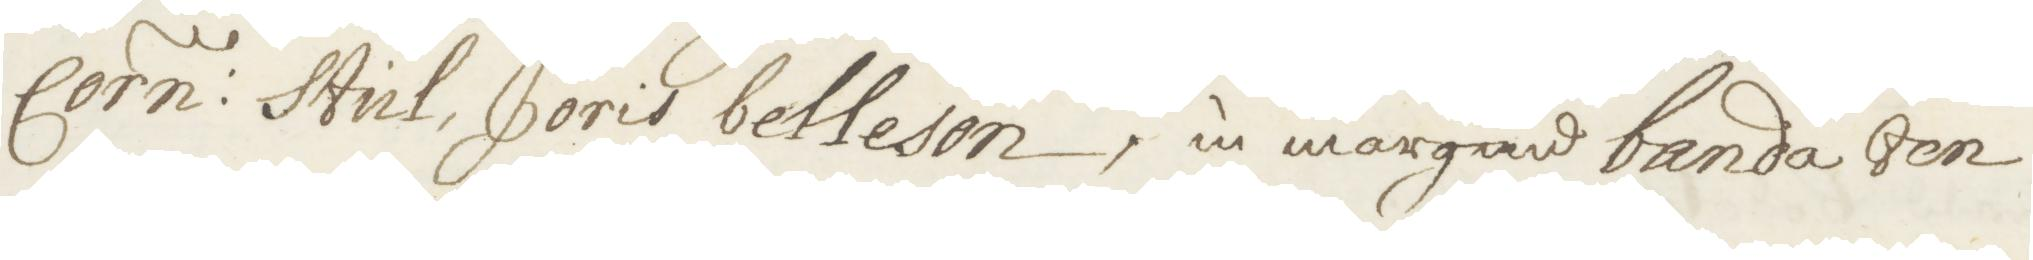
Corn:' Stul, Joris belleson, in margine banda ten
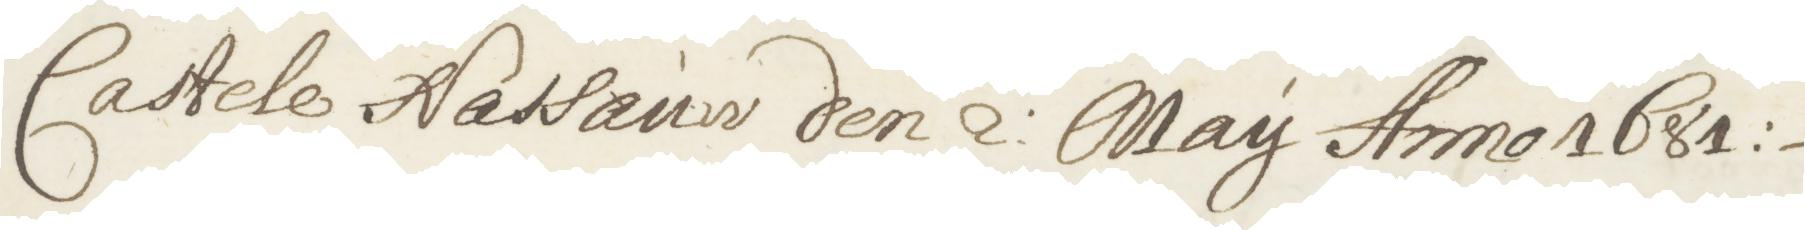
Castele Nassauw den 2: Maij Anno 1681:—
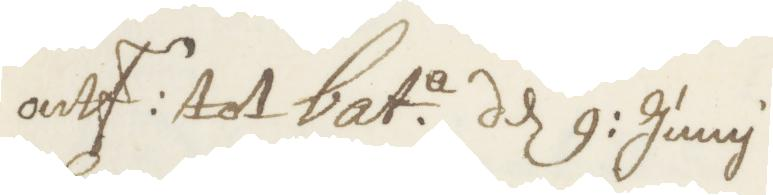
ontf: tot bat.a den 9: Junij
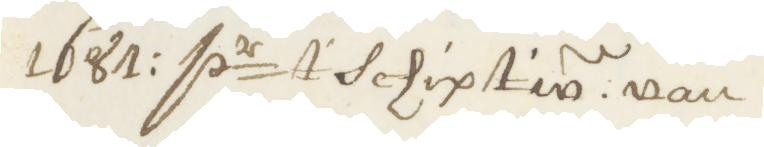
1681: p=r t' schip t' w:n van
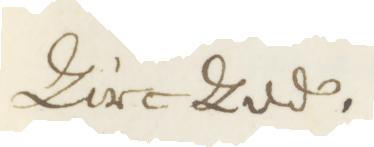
Zirczee.
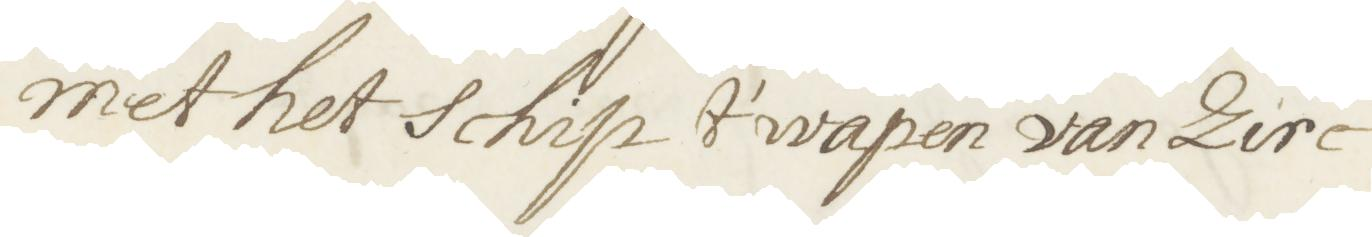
met het schip 't wapen van Zirc
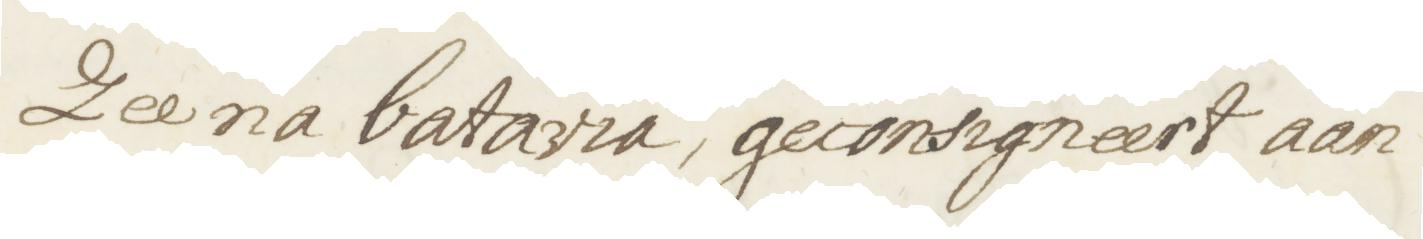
Zee na batavia, geconsigneert aan
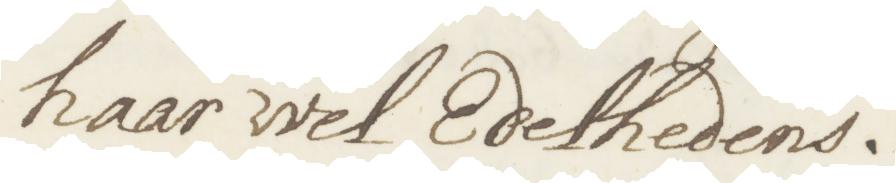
haar wel Edelhedens.
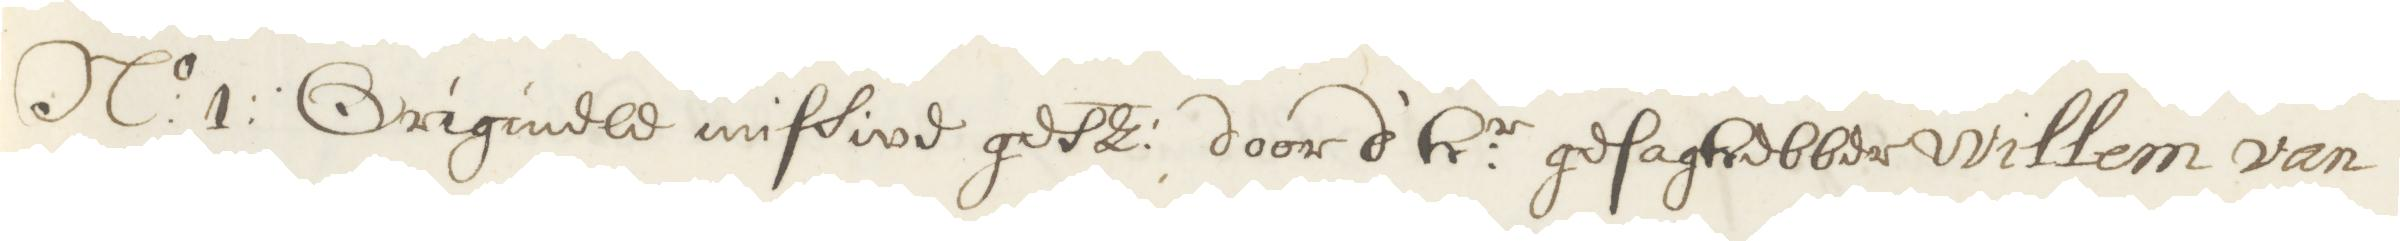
N:o 1: Originele missive gesz: door d’ h:r gesaghebber willem van
